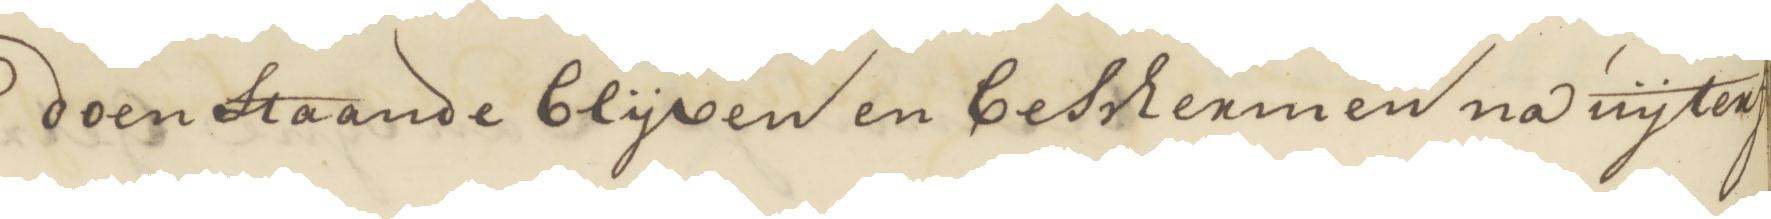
doen staande blijven en beschermen na uijter
